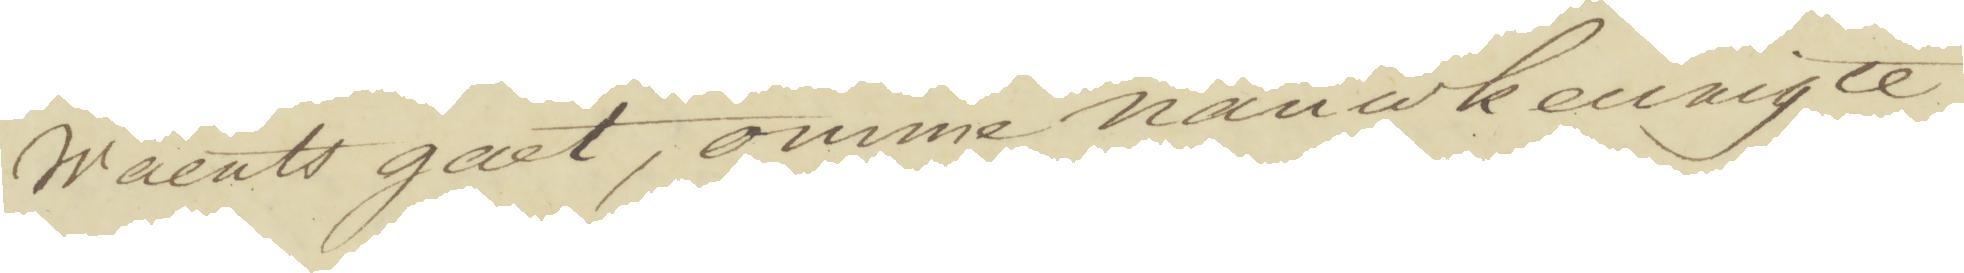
waerts gaet, omme nauwkeurig te
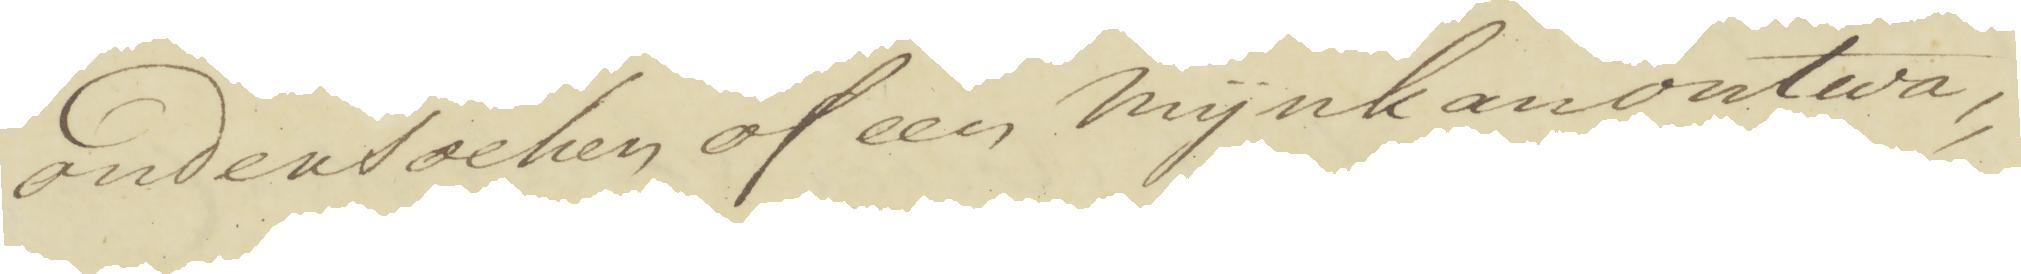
ondersoeken of een mijn kan ontwa„
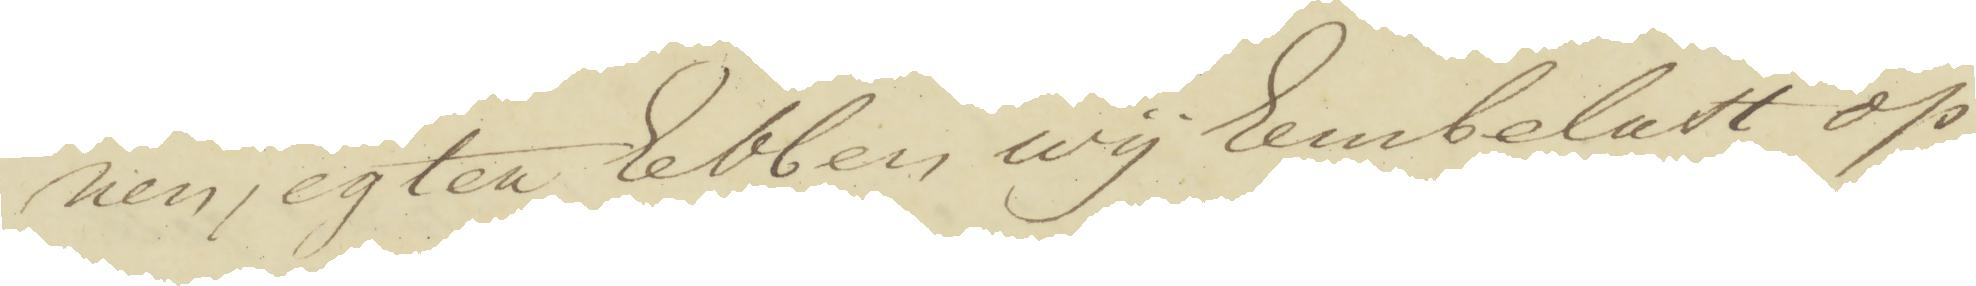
ren, egter hebben wij hem belast op
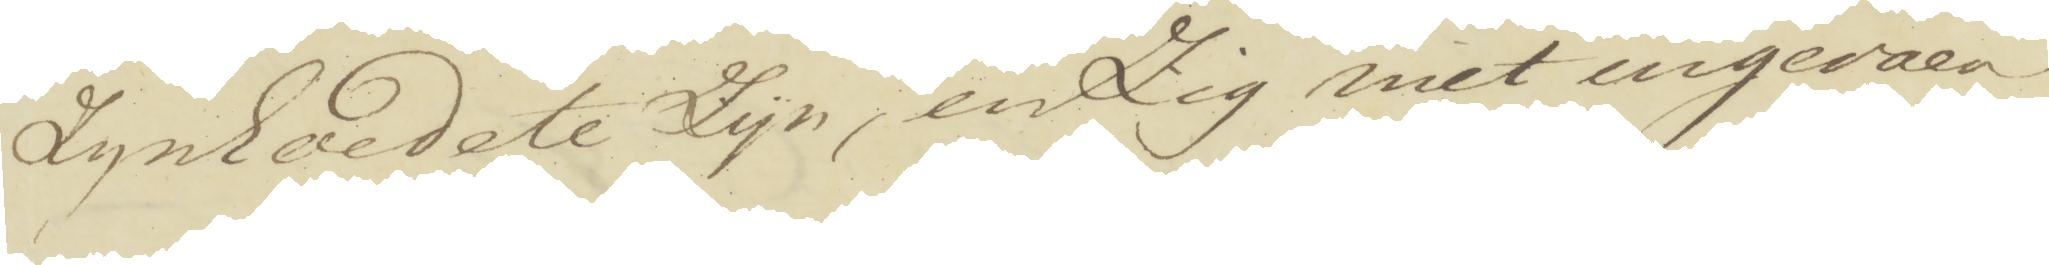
zyn hoede te zijn, en zig niet ingevaer
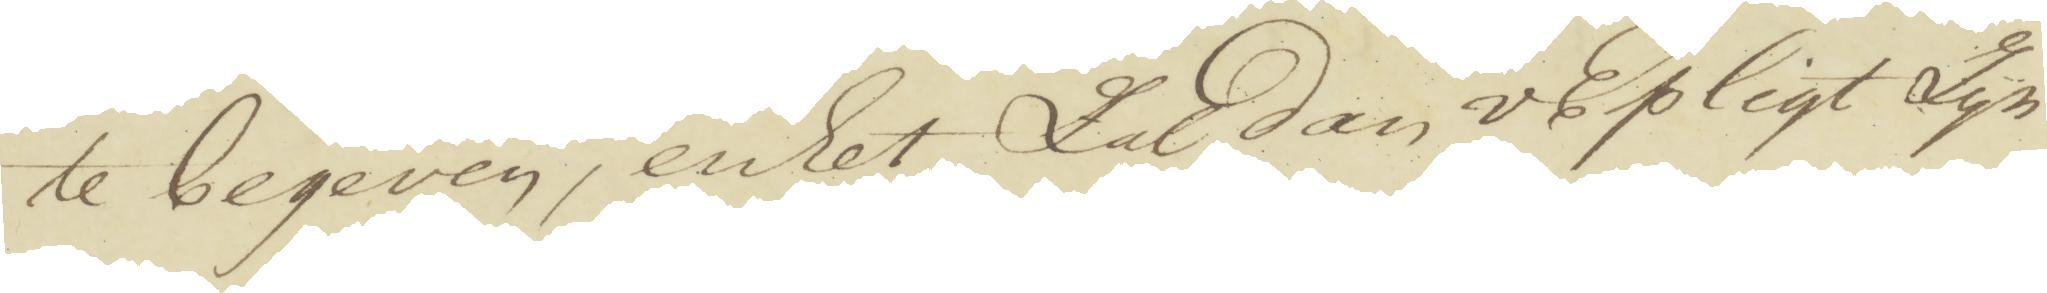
te begeven, en het zal dan vE pligt zijn
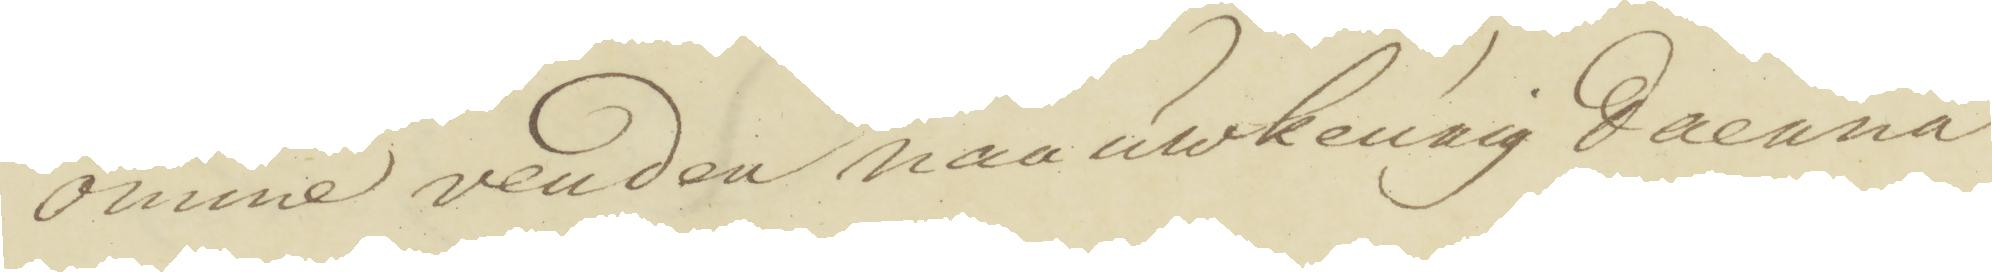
omme verder naauwkeurig daerna
